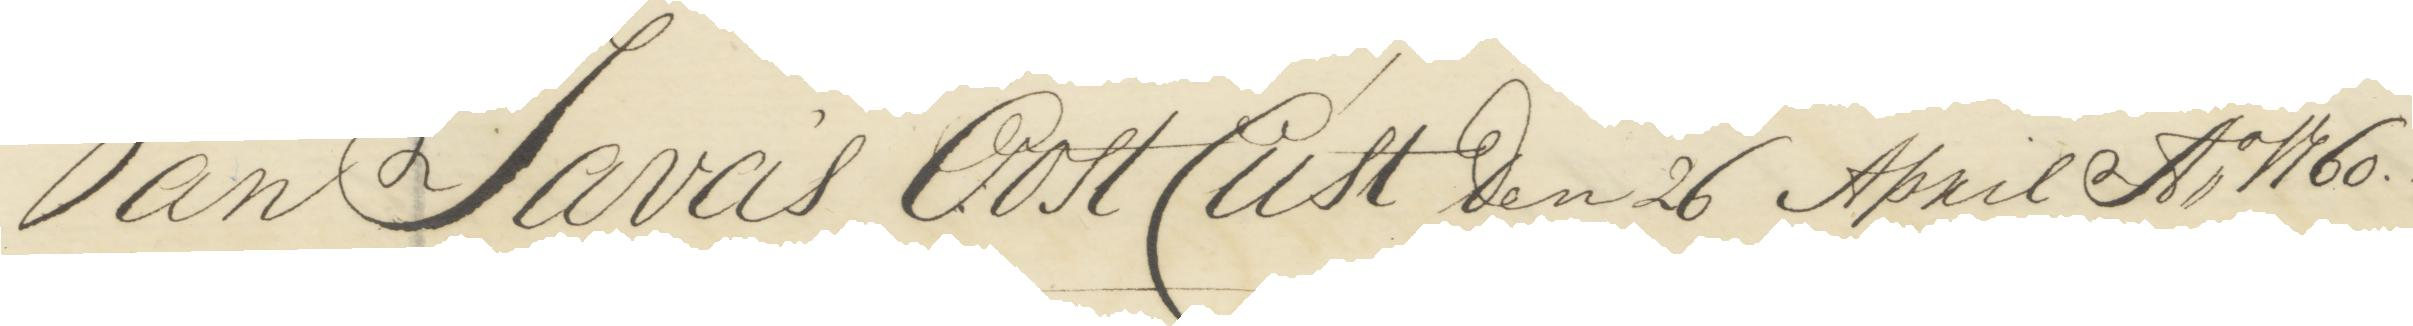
Van Java's Oost Cust den 26 April A„o 1760.
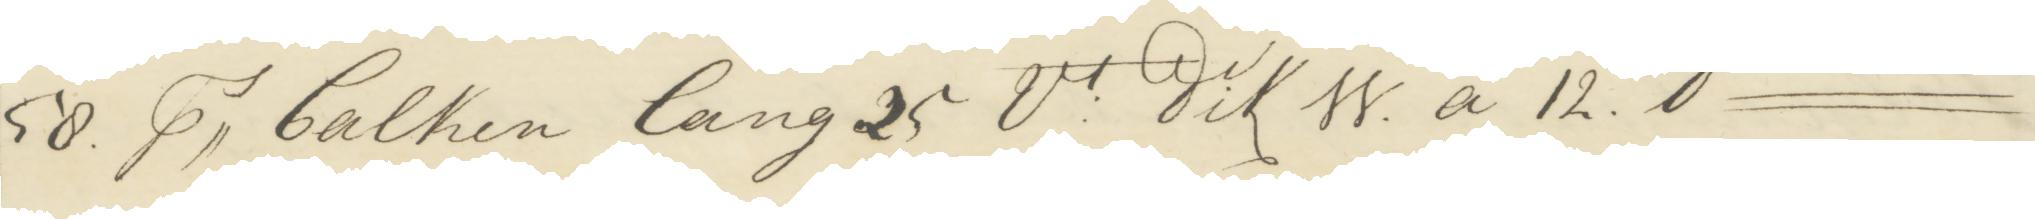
58. p„s balken lang 25 V:t dik 11. â 12. d=m
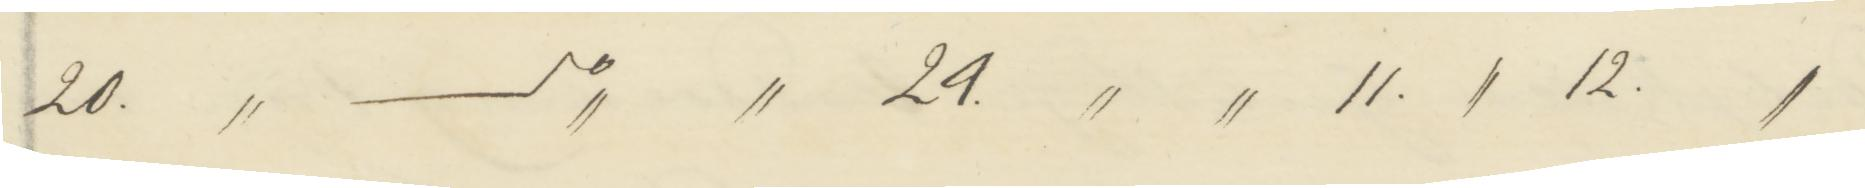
20. „ _„o „ 24. „ „ 11. „ 12. „
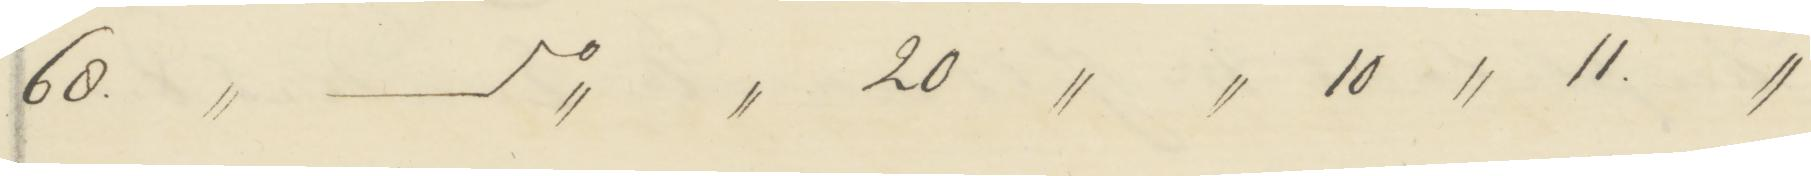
68. „ _„o „ 20 „ „ 10 „ 11. „
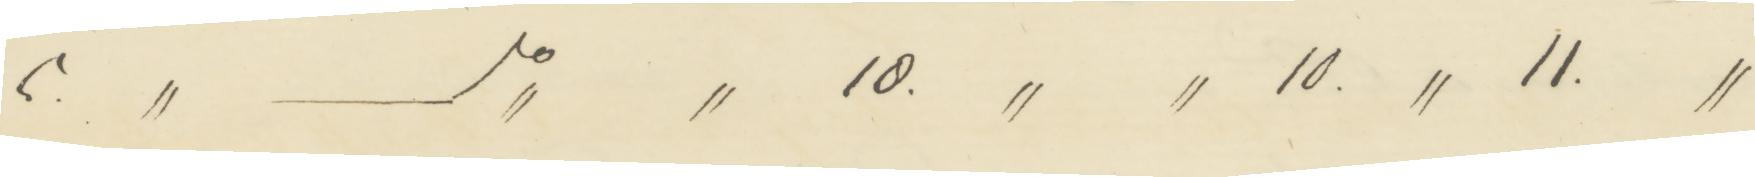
5. „ _„o „ 18. „ „ 10. „ 11. „
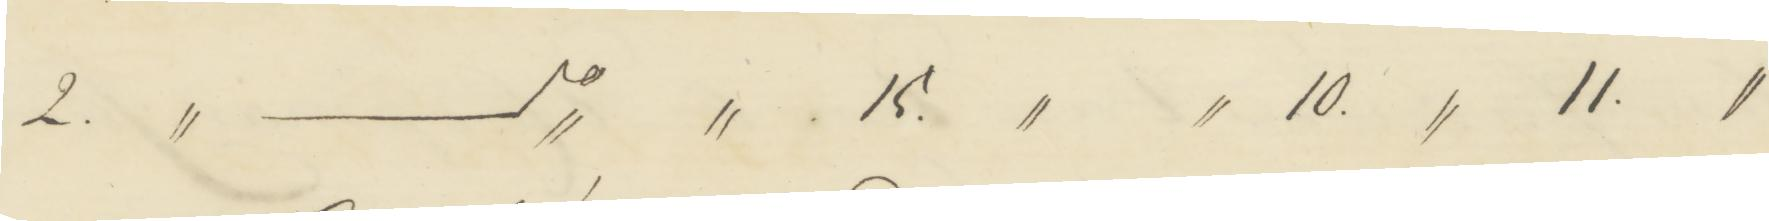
2. „ _„o „ 15. „ „ 10. „ 11. „
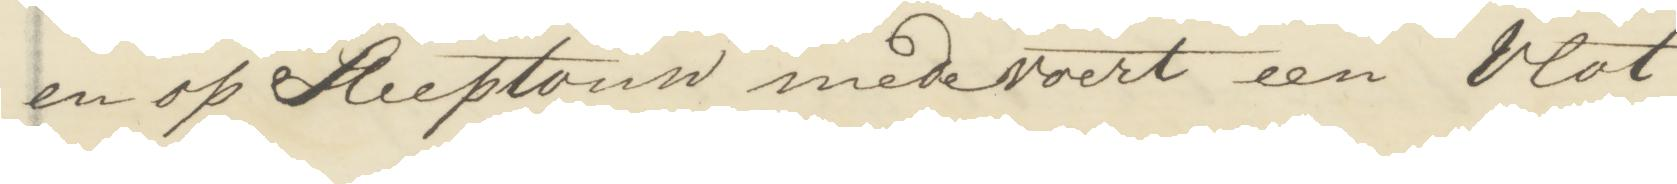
en op sleeptouw mede voert een vlot
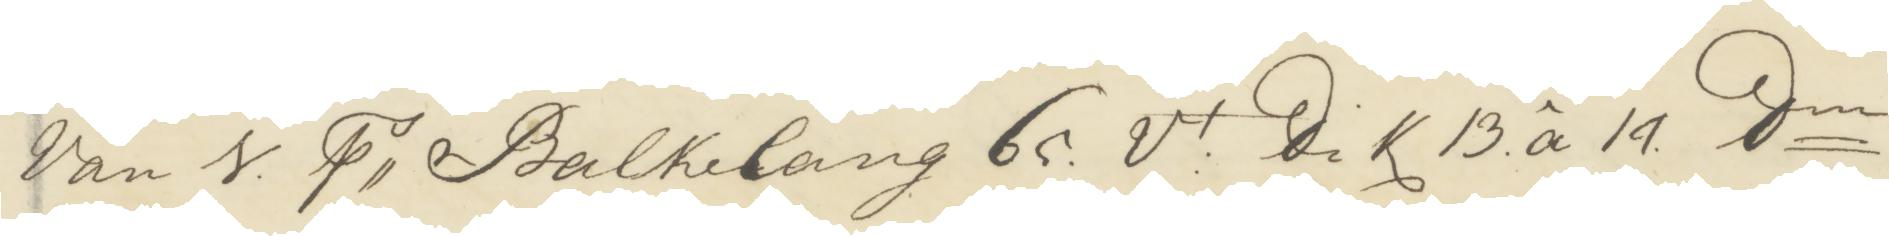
van 1. p„s Balke lang 65. V:t dik 13. â 14. d=m
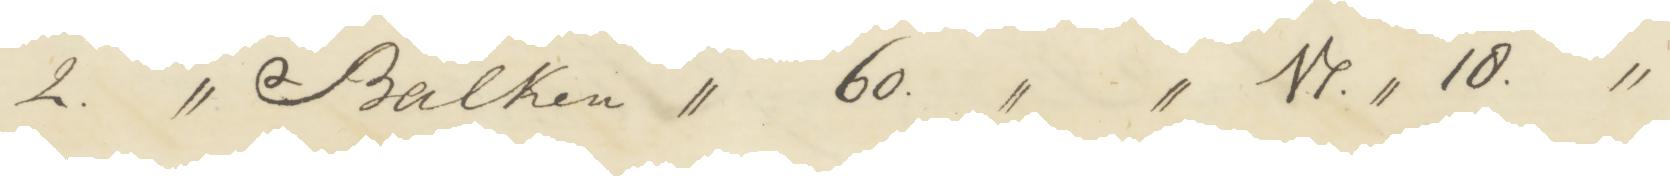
2. „ Balken „ 60. „ „ 17. „ 18. „
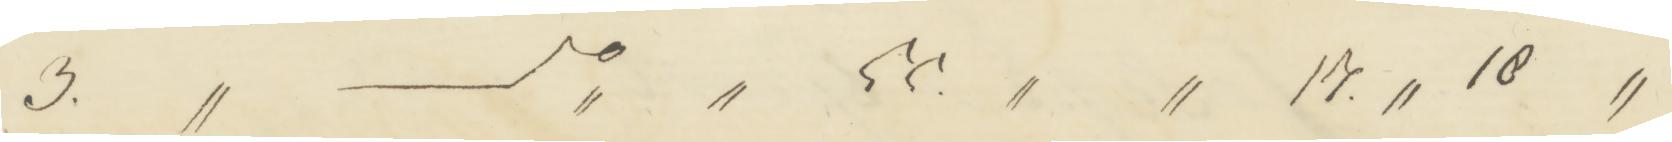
3. „ d„o „ 55. „ „ 17. „ 18 „
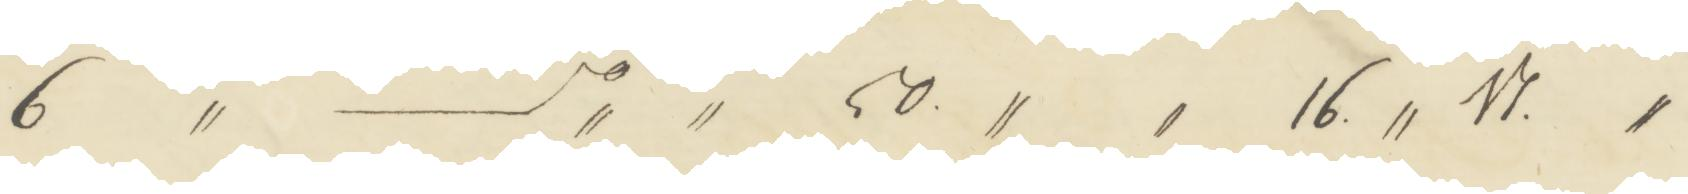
6 „ d„o „ 50. „ „ 16. „ 17. „
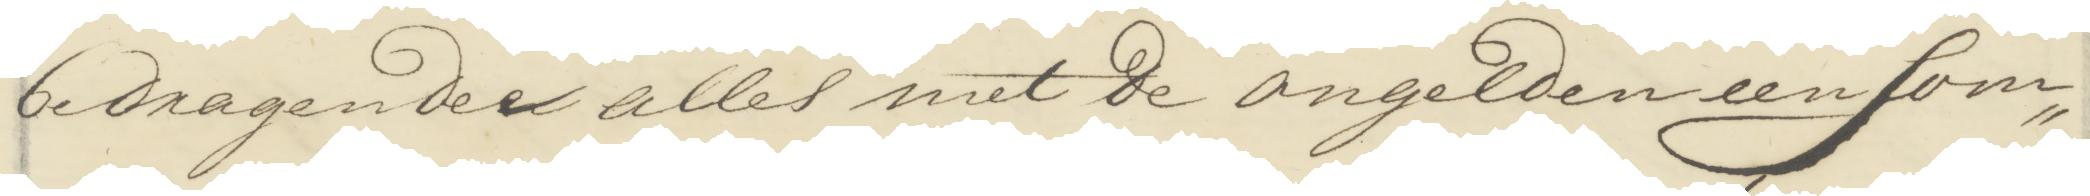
bedragen alles met de ongelden een som„
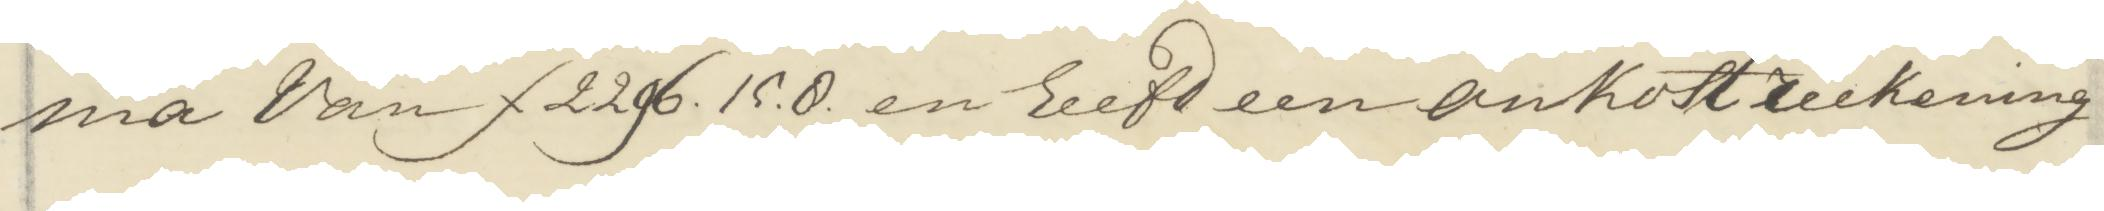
ma van ƒ2296.15.8. en heefd een onkost reekening
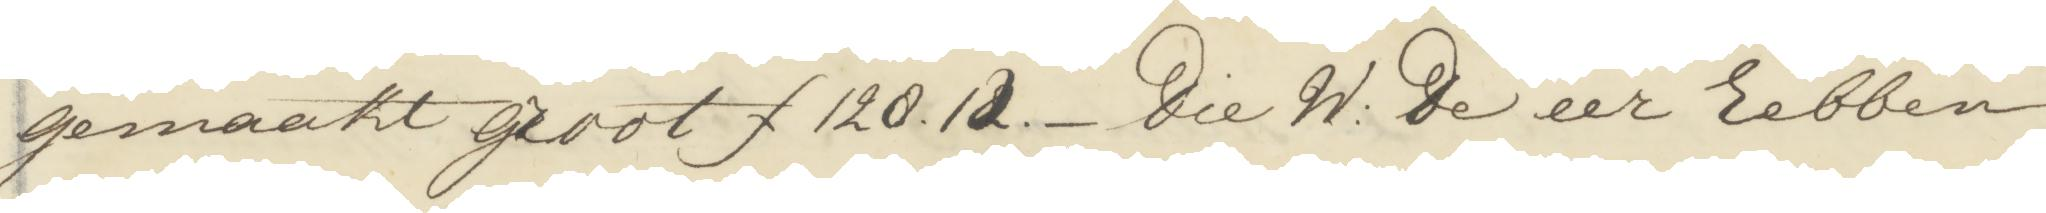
gemaakt groot ƒ128.12.— die W: de eer hebben
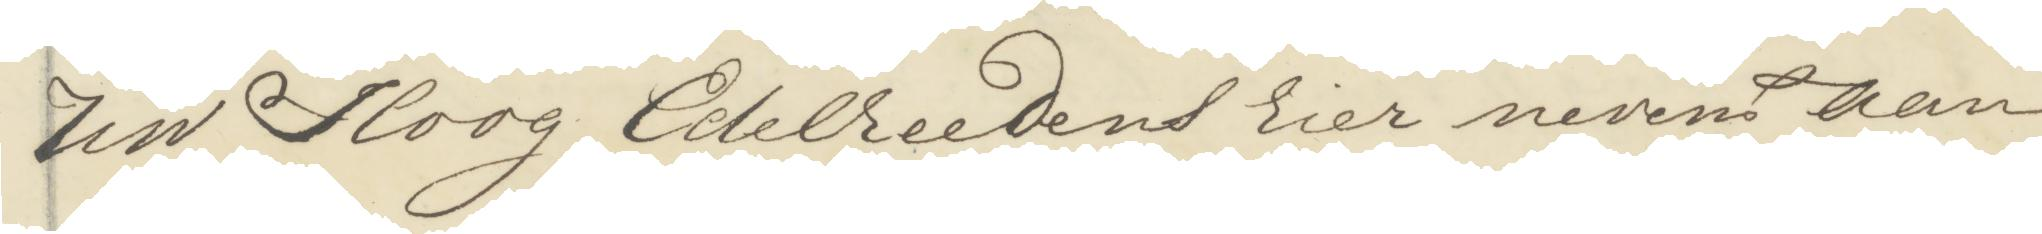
uw Hoog Edelheedens hier nevens aan
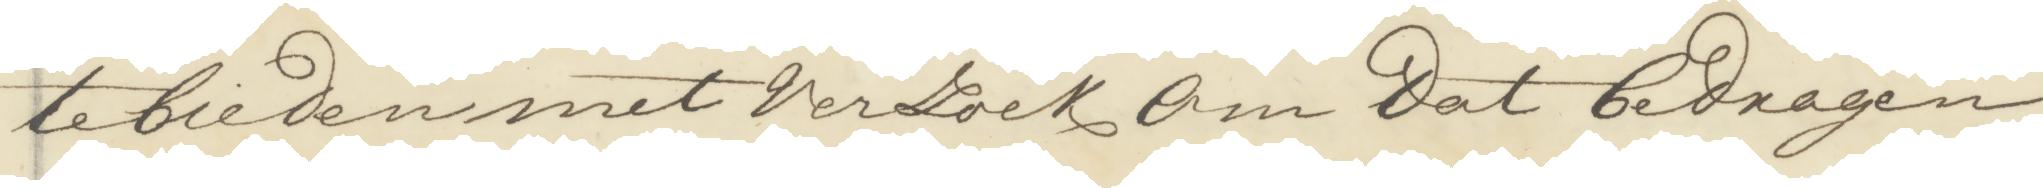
te bieden met verzoek om dat bedragen
